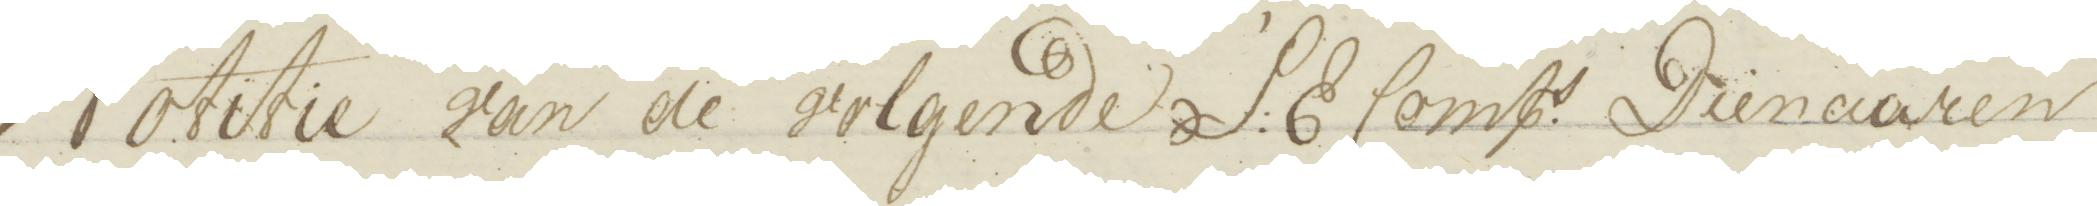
Notitie van de volgende 'S: E Comp.s Dienaaren
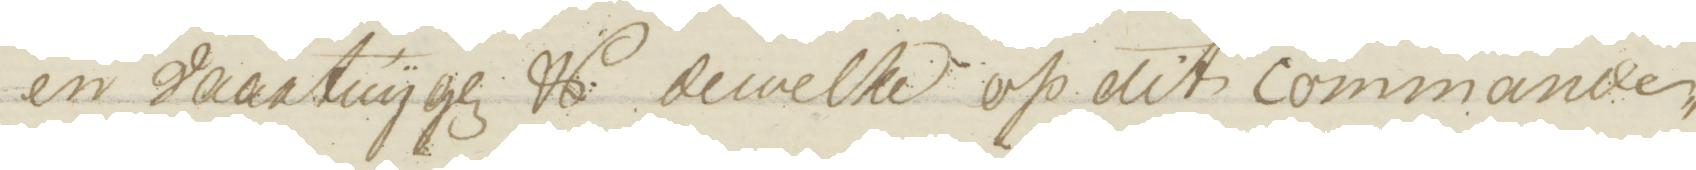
en vaartuijgen VE: dewelke op dit commande„
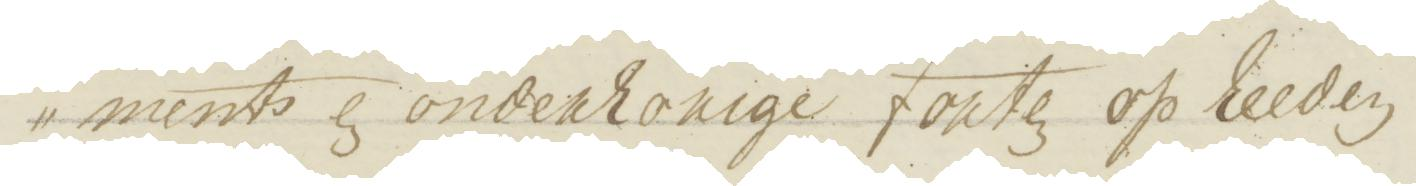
„ments en onderhorige forten op heeden
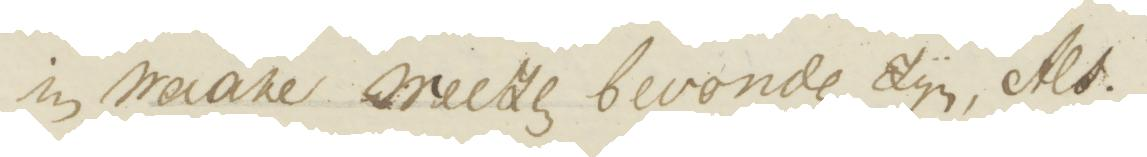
in waare weezen bevonden zijn, Als.
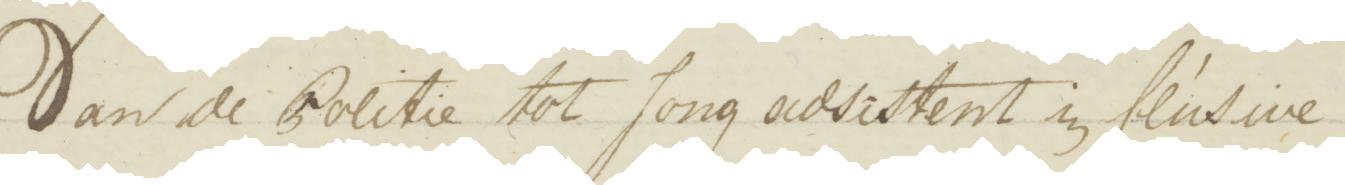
Van de Politie tot Jong adsistent in Clusive
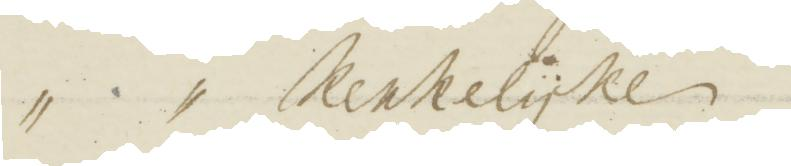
„ „ kerkelijke
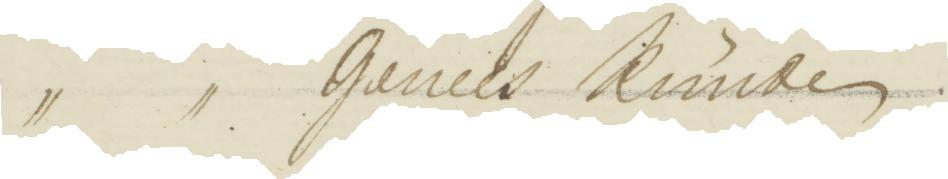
„ „ genees kunde
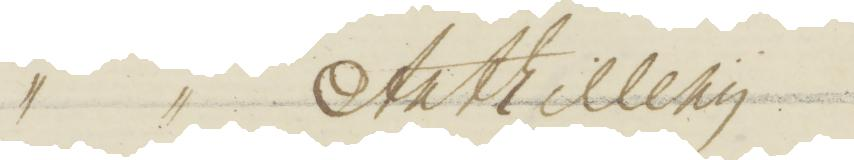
„ „ Arthillerij
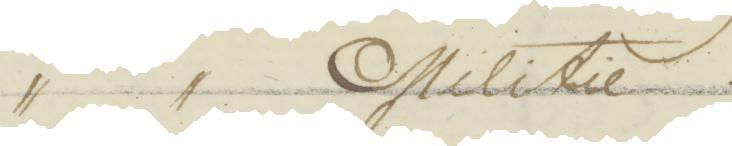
„ „ Militie
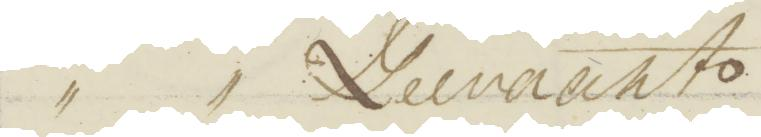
„ „ Zeevaart
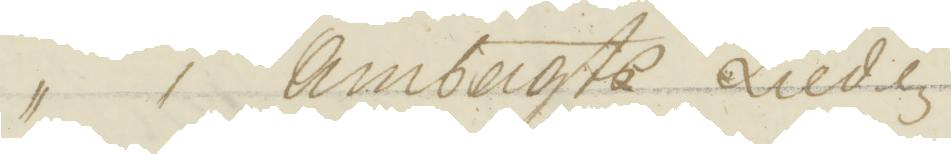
„ „ Ambagts Lieden
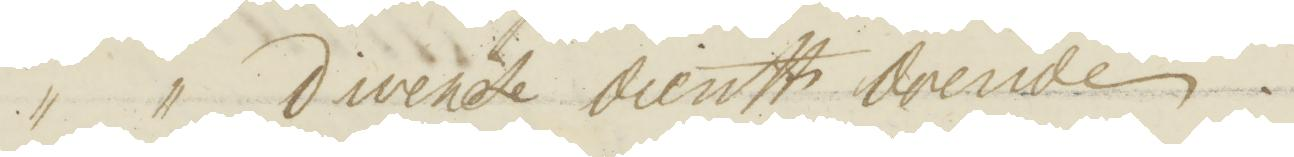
„ „ diverse dienst doende
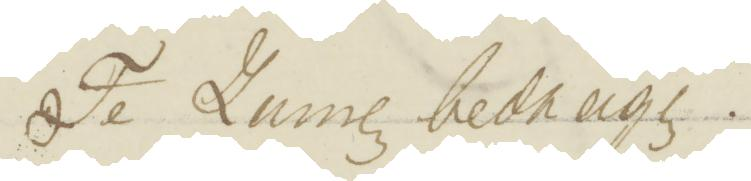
Te zamen bedragen
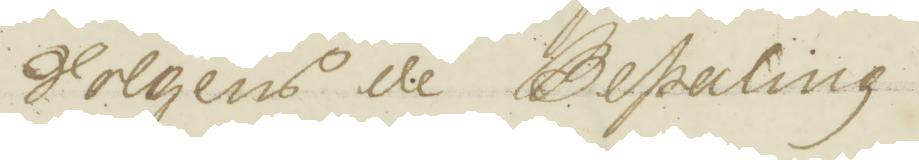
volgens de Bepaling
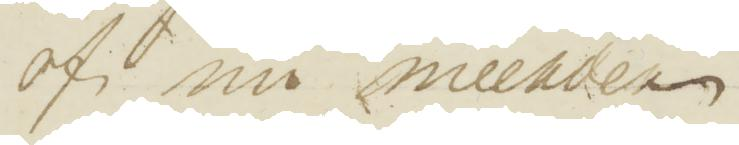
of nu meerder
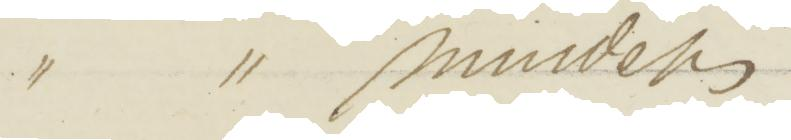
„ „ minder
